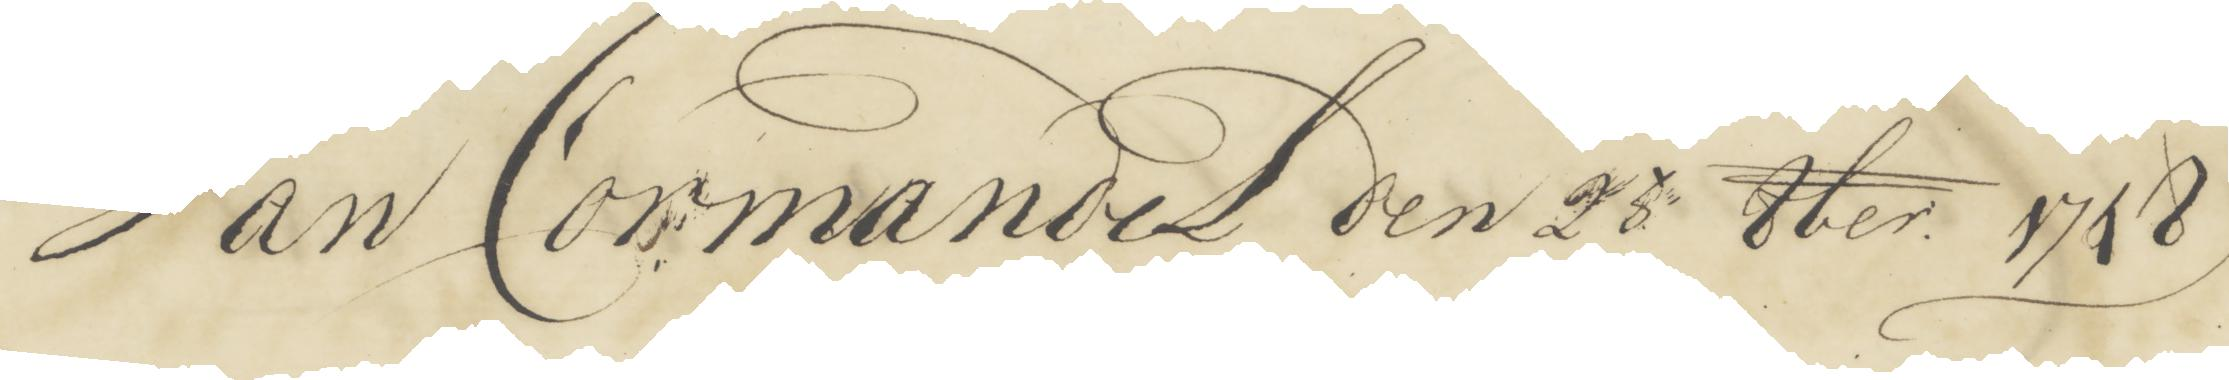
Van Cormandel den 28' 8ber: 1748
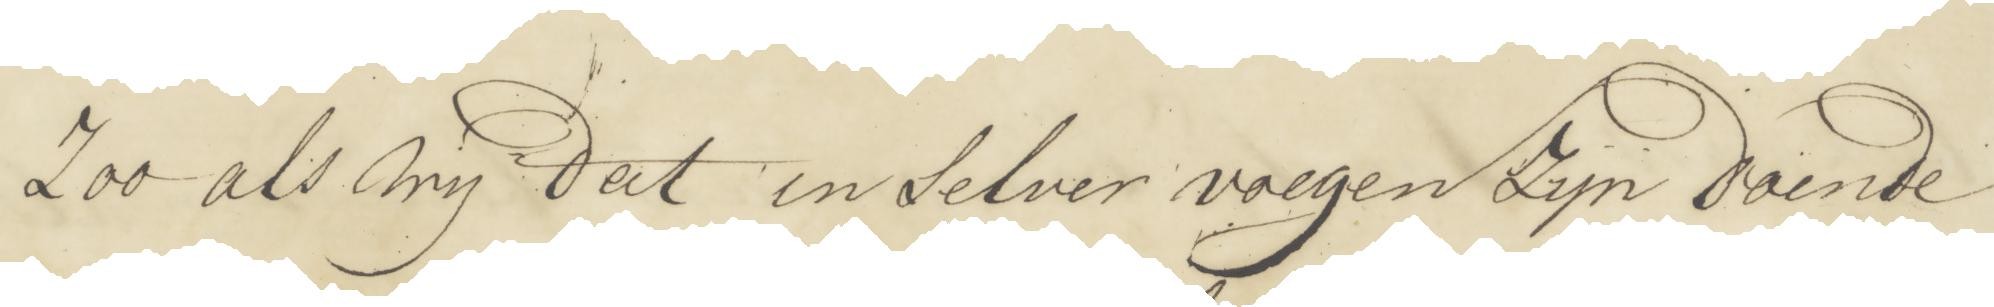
zoo als wij dat in selver voegen zijn doende
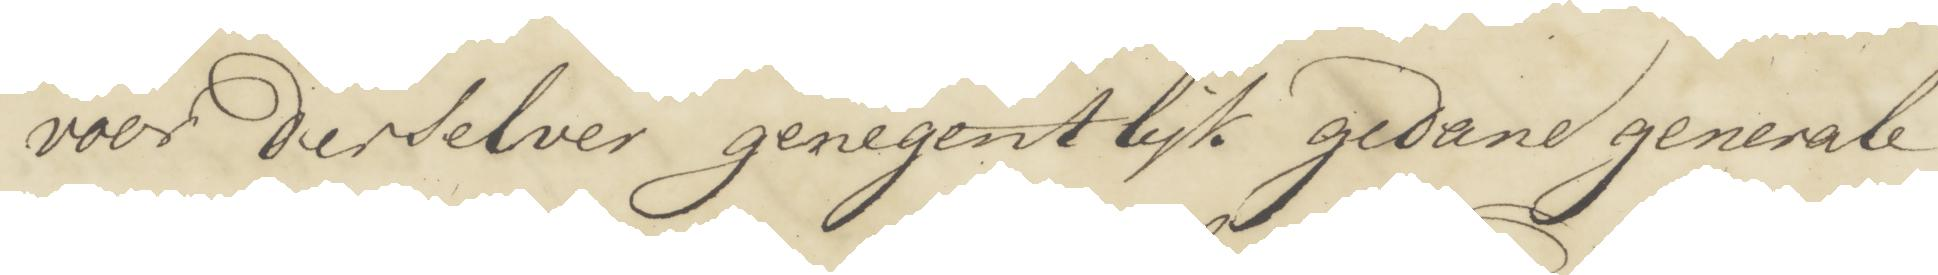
voor derselver genegentlijk gedane generale
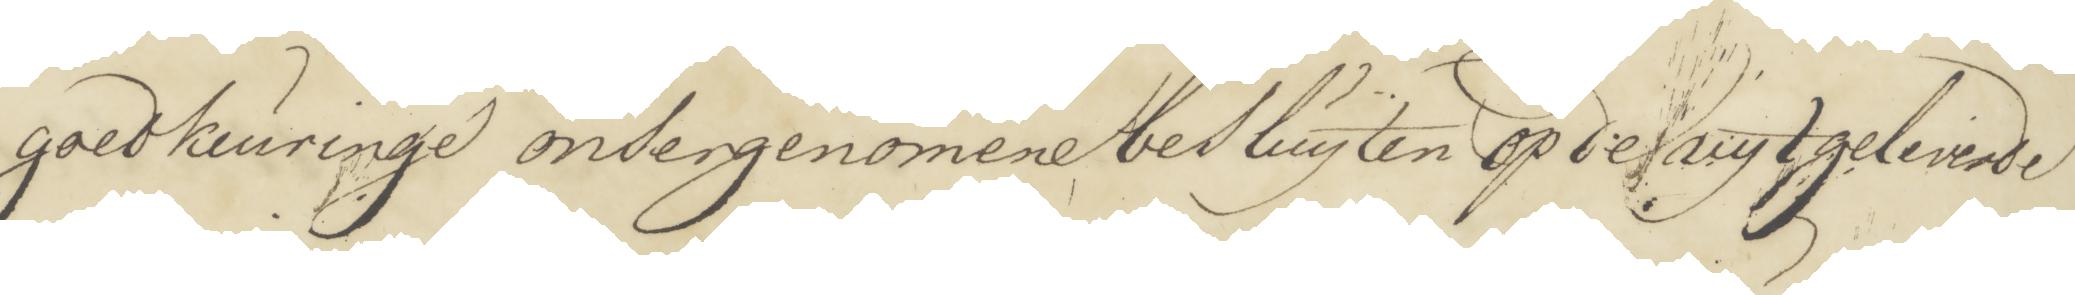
goedkeuringe onsergenomene besluijten op des uijtgeleverde
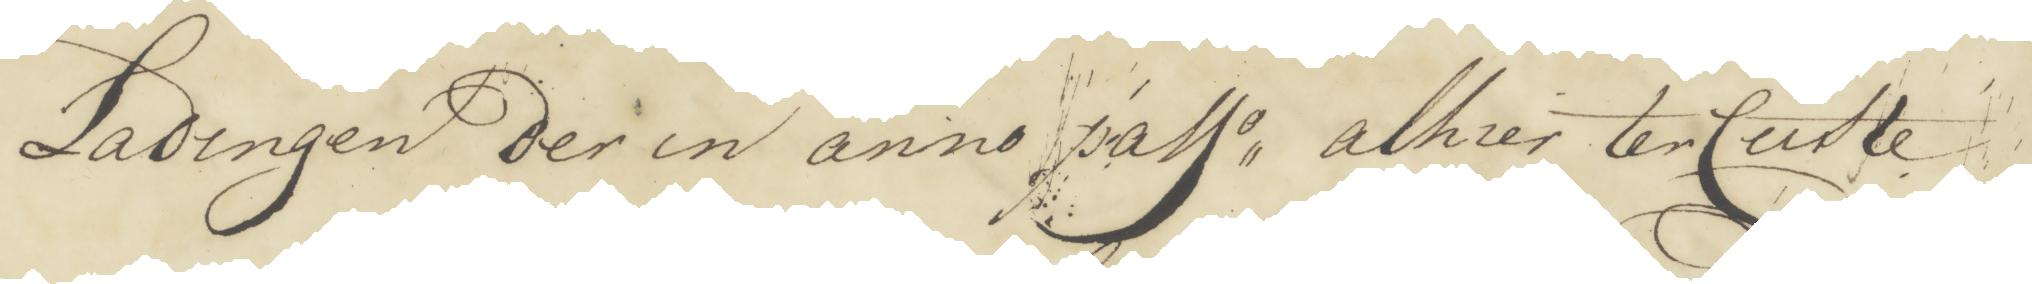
Ladingen der in anno pass„o alhier ter Custe
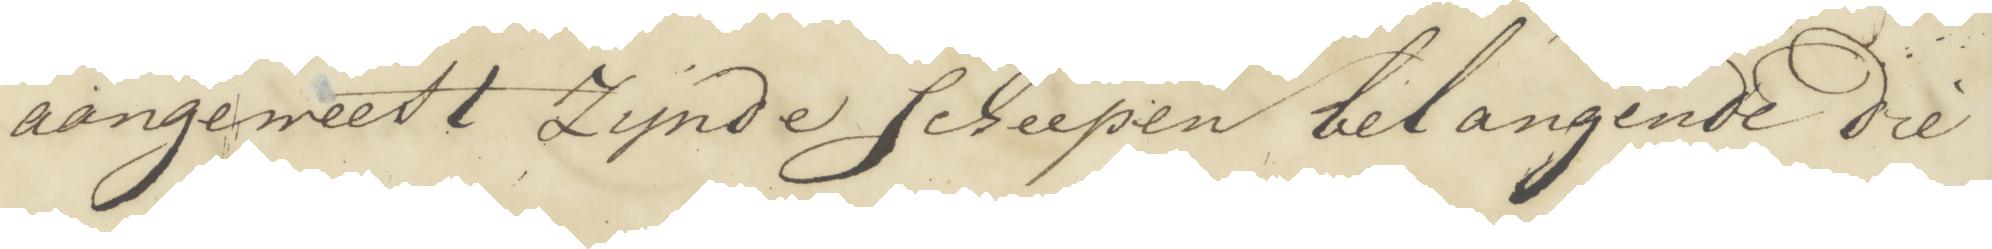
aangeweest zijnde scheepen belangende die
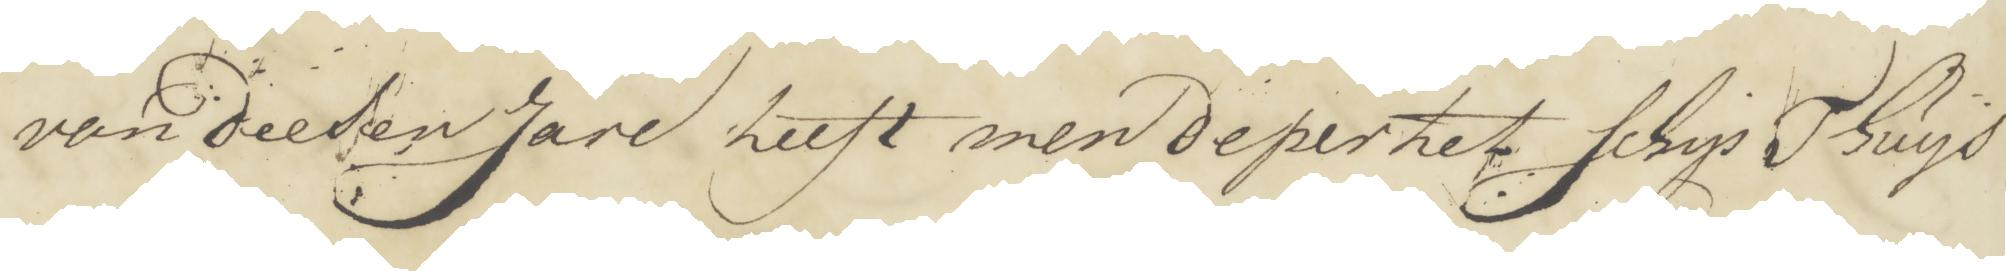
van deesen Jare heeft men de per het schip Thuijs
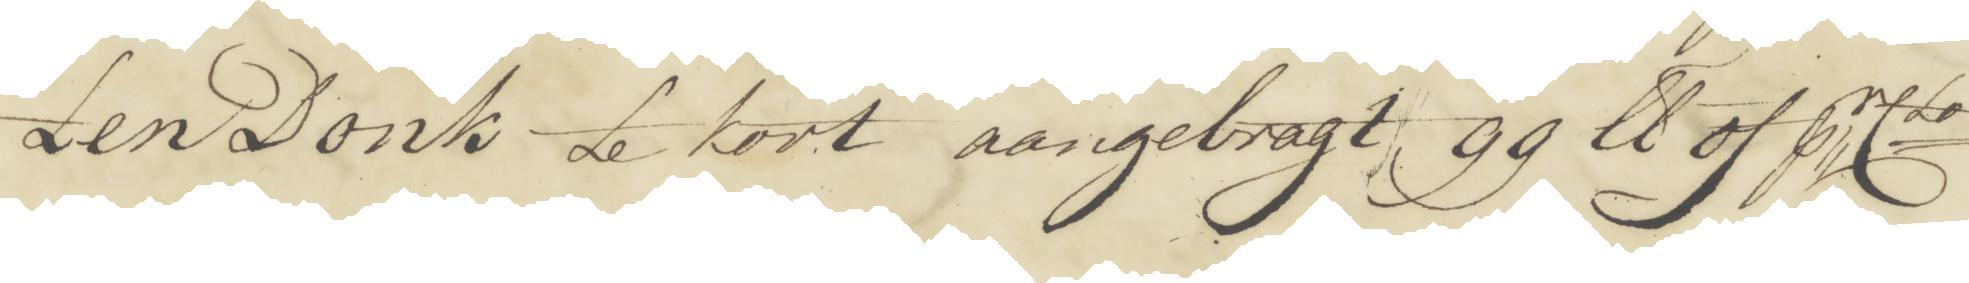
ten Donk te kort aangebragt 99 lb of p„r C=to
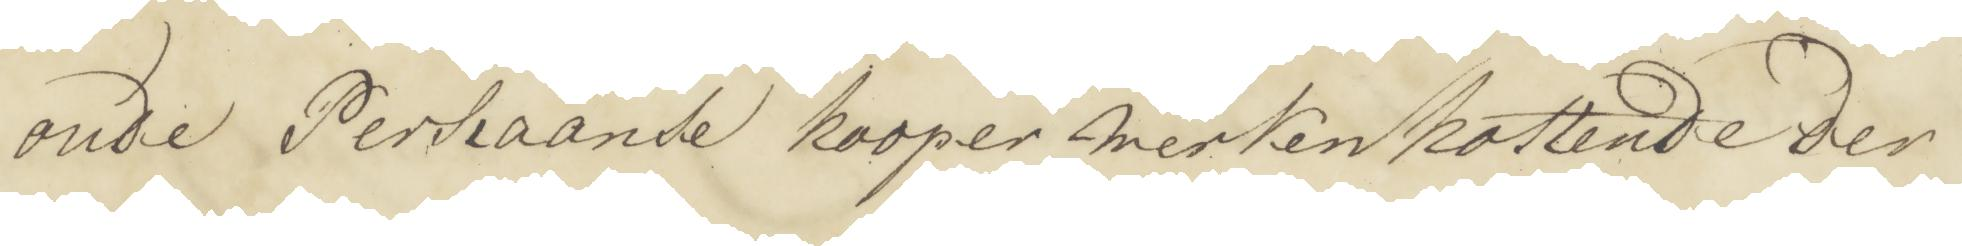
oude Persiaanse kooper werken kostende der
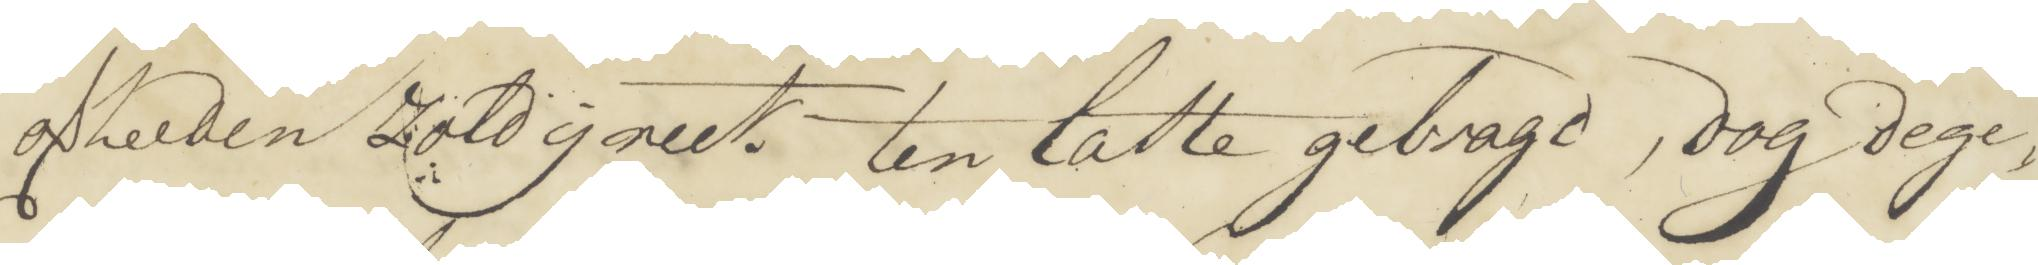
overheeden zoldijreek ten laste gebragd, dog dege„
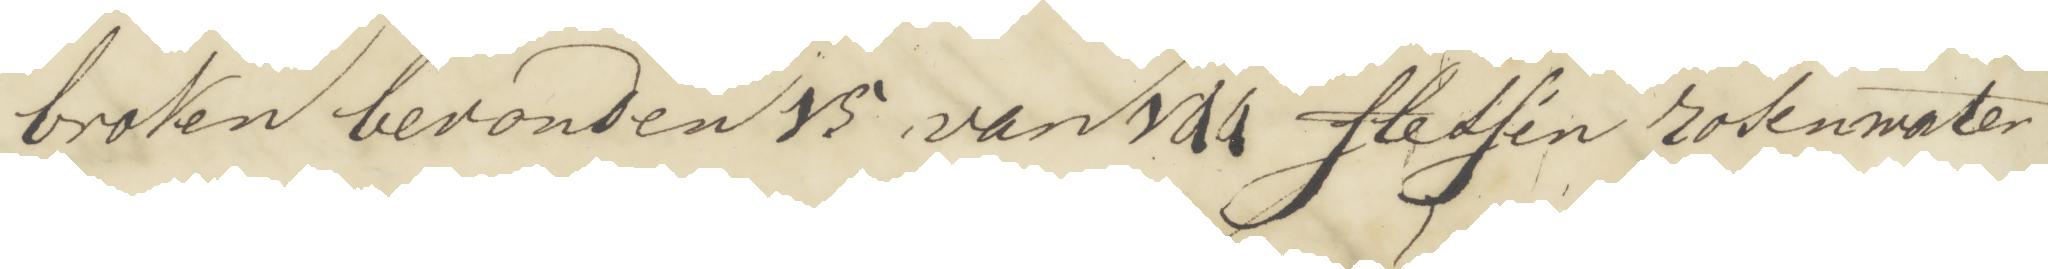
broken bevonden 15 van 144 flessen rosenwater
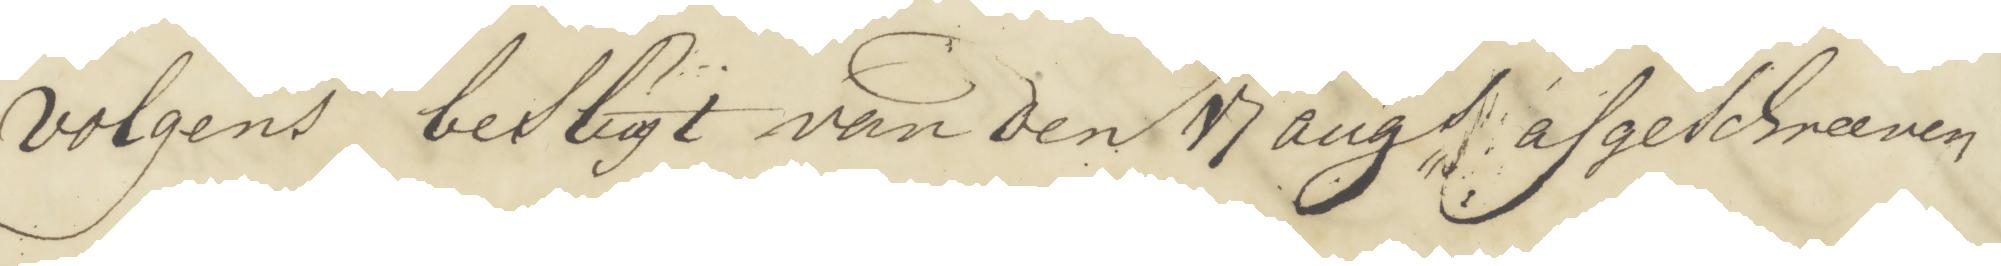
volgens besluijt van den 17 aug„s afgeschreeven
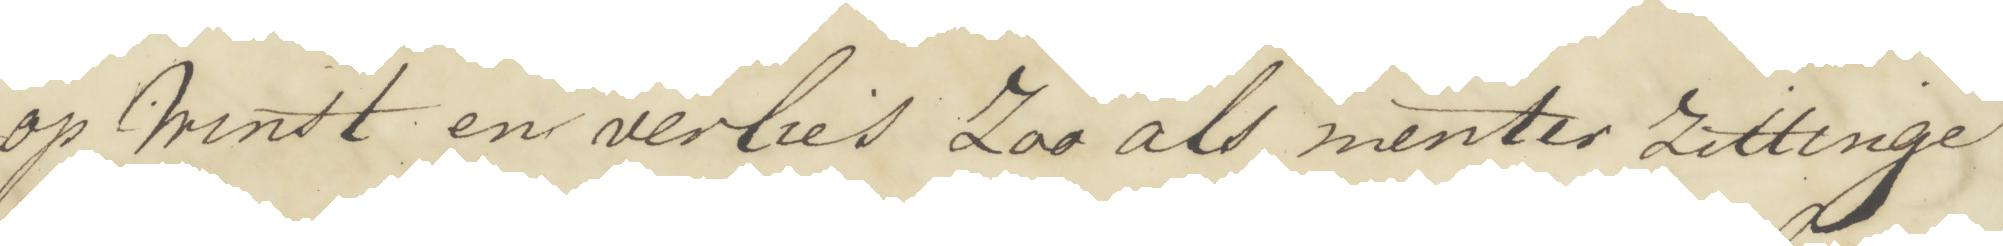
op winst en verlies zoo als menter zittinge
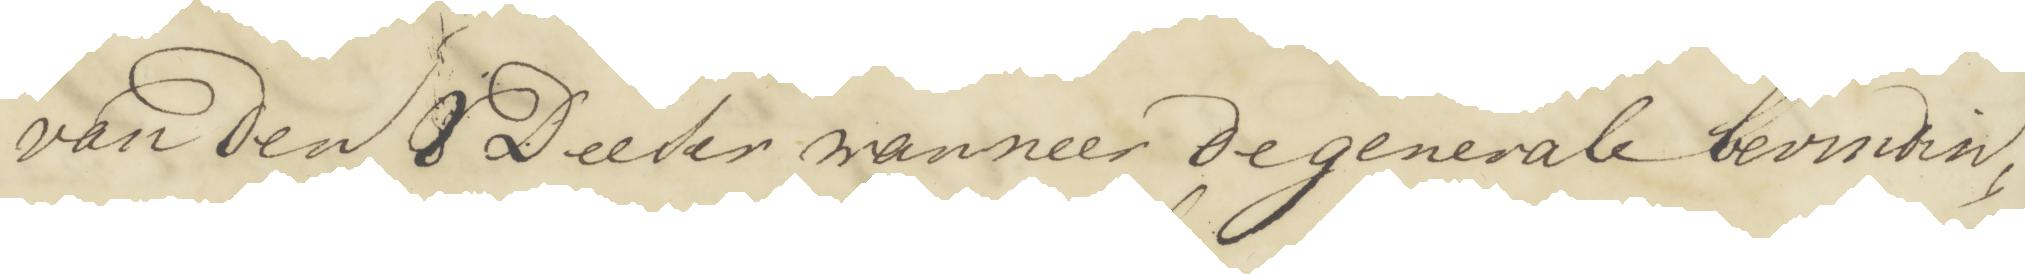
van den 8 Deeser wanneer de generale bevindin„
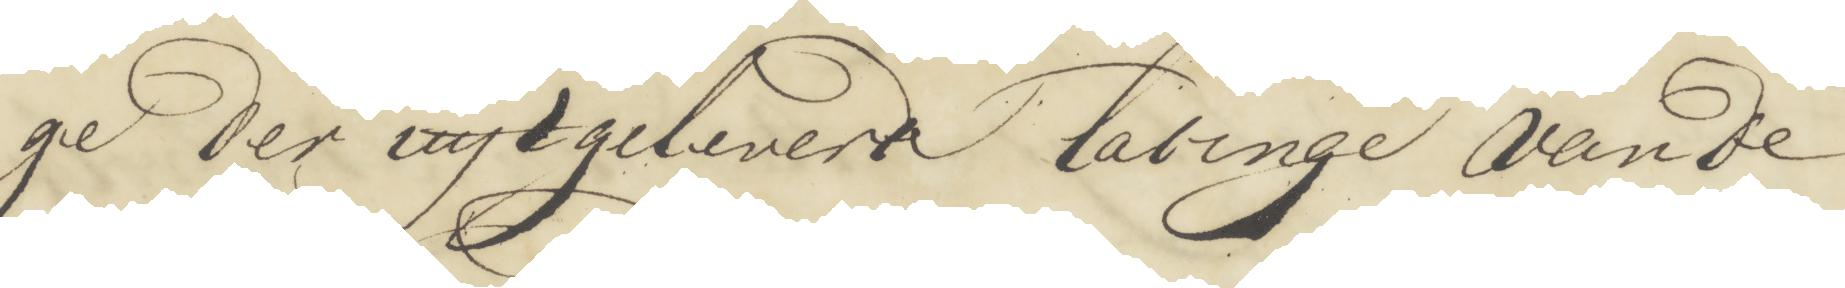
ge der uijtgeleverde ladinge van de
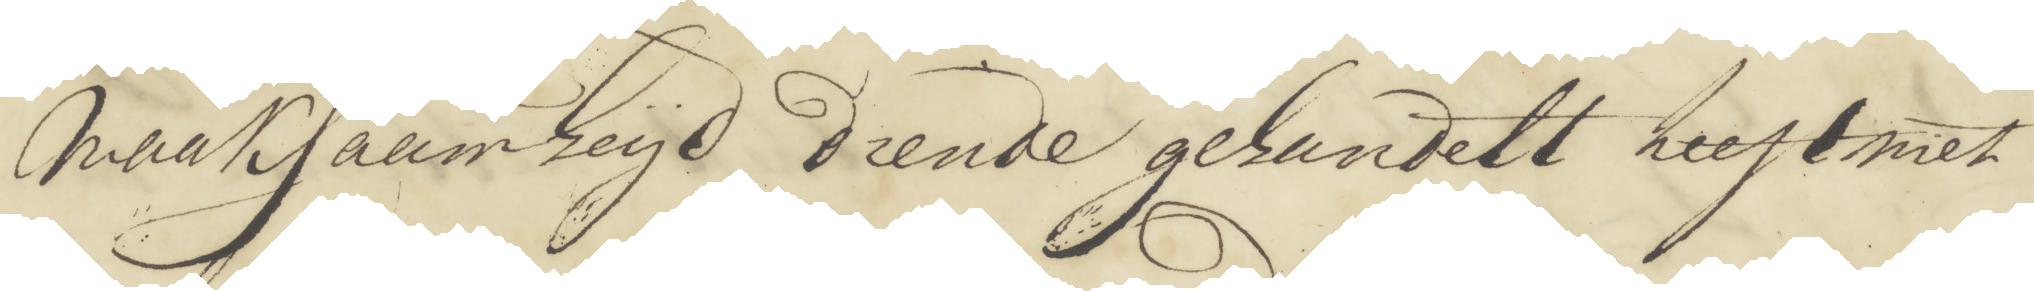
waaksaamheijd diende gehandelt heeft met
